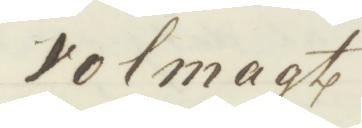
Volmagt
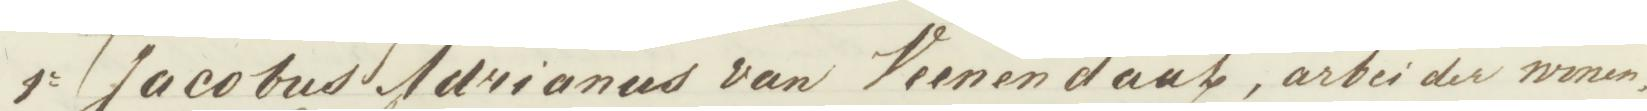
1_e Jacobus Adrianus van Veenendaal, arbei der wonen
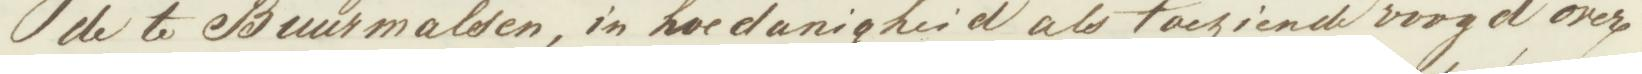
de te Buurmalsen, in hoedanigheid als toeziende voogd over
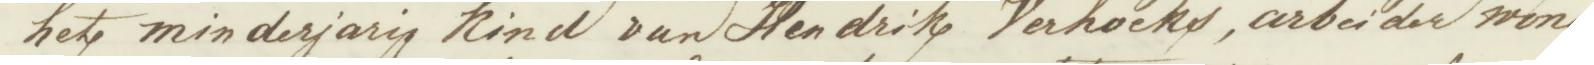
het minderjarig kind van Hendrik Verhoeks, arbeider wonen
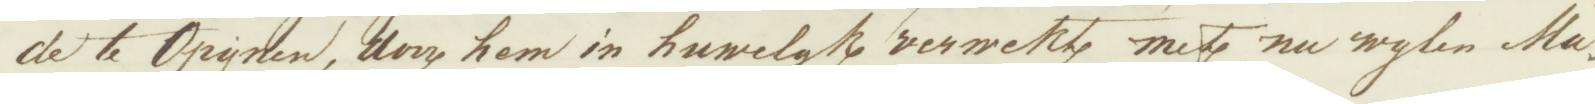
de te Opijnen, door hem in huwelyk verwekt met nu wylen Ma
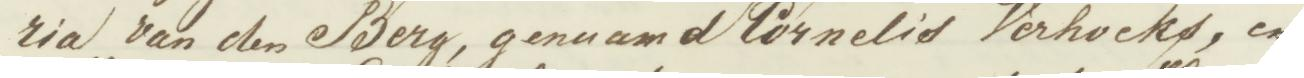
ria van den Berg genaamd Cornelis Verhoeks, en
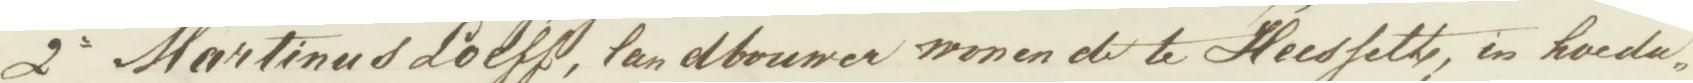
2-e Martinus Loeff, landbouwer wonende te Heesselt, in hoeda„
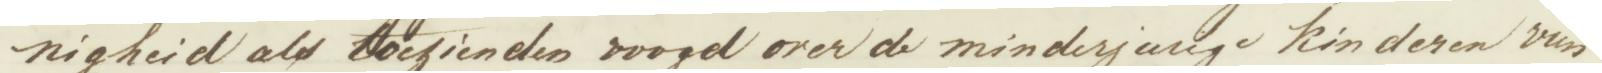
nigheid als toezienden voogd over de minderjarige kinderen van
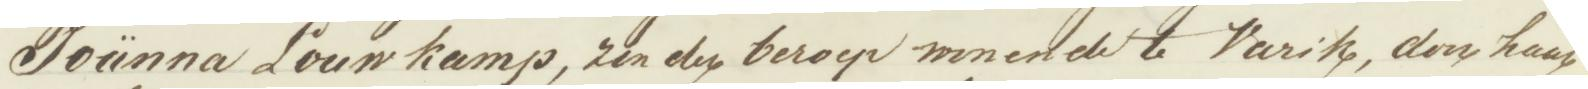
Joänna Louwkamp, zon der beroep wonende te Varik, door haar
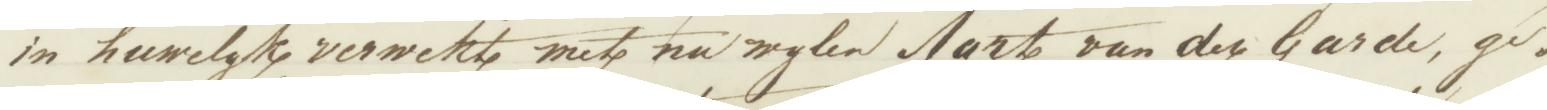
in huwelyk verwekt met nu wylen Aart van der Garde, ge
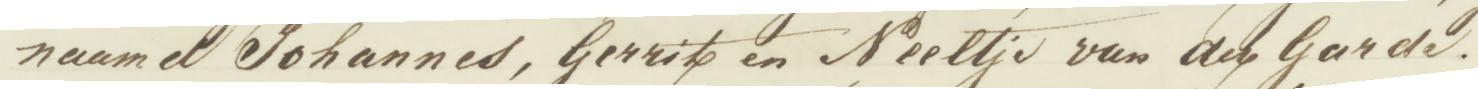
naamd Iohannes, Gerrit en Neeltje van der Garde.
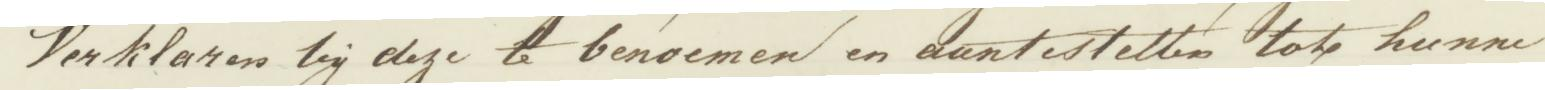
Verklaren bij deze te benoemen en aante stellen tot hunne
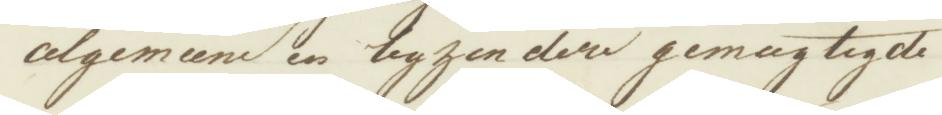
algemeene en byzon dere gemagtigde
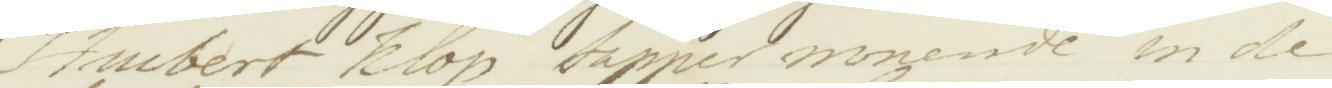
Huibert Klop tapper wonende in de
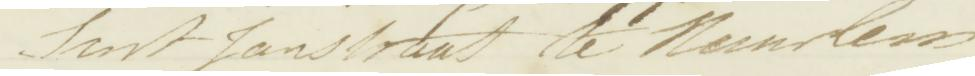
Sint Janstraat te Haarlem
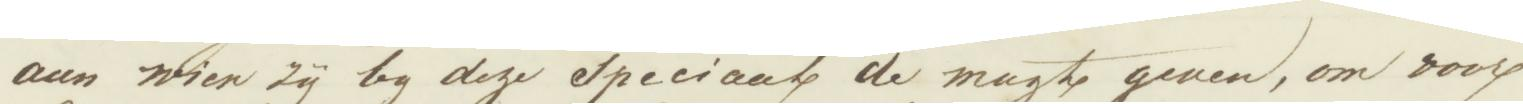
aan wien zij by deze speciaal de magt geven, om voor
